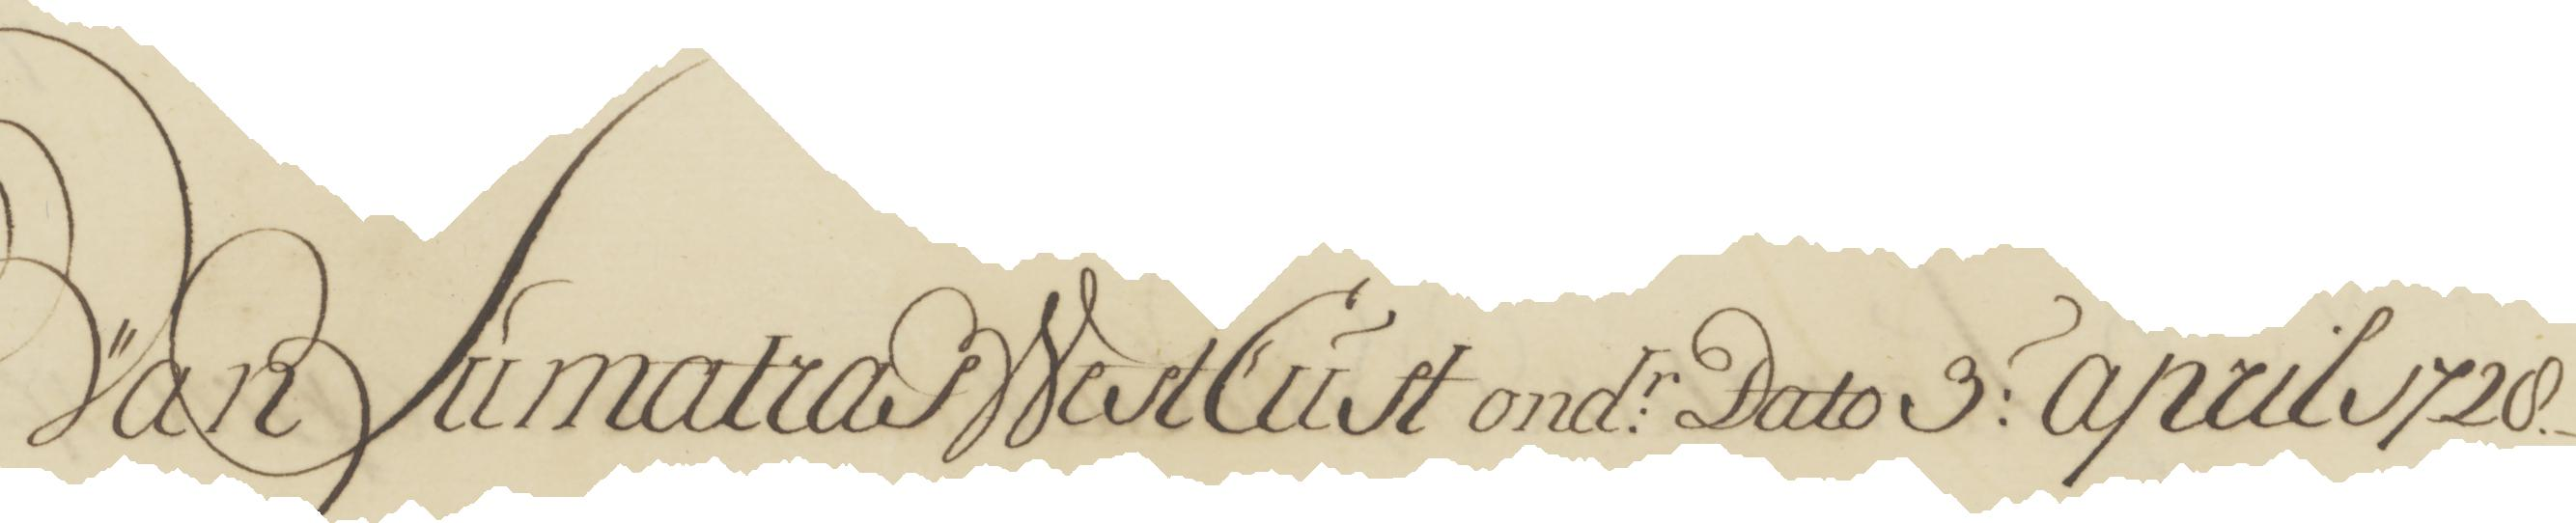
Van Sumatras West Cust ond:r dato 3:' april 1728.
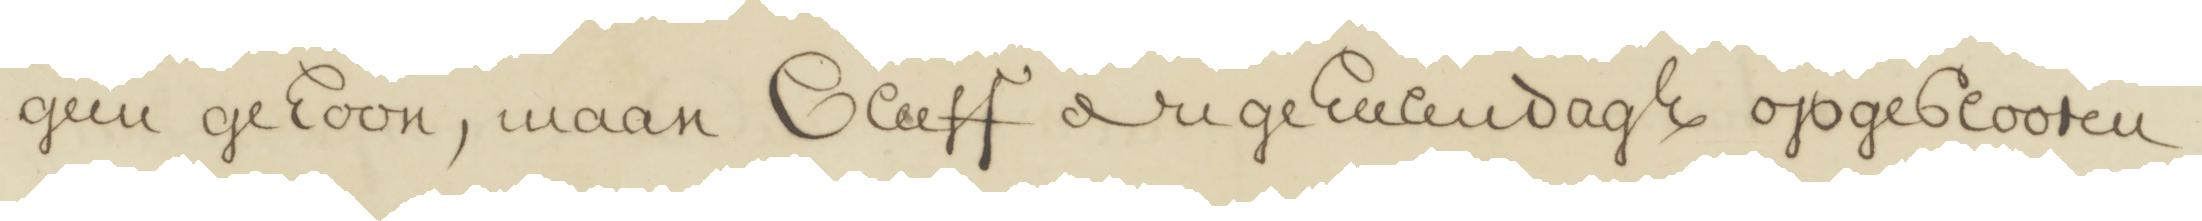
geen gehoor, maar Bleeff den geheelen dagh opgeslooten
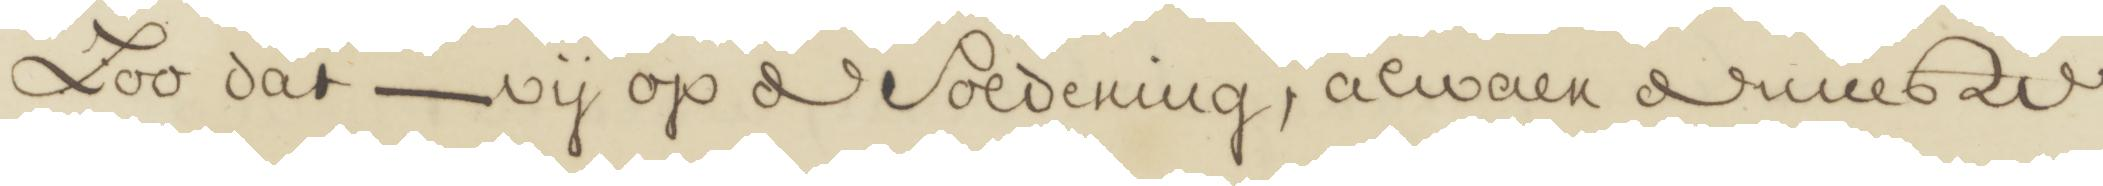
Zoo datwij op de Soldering, alwaer de meeste
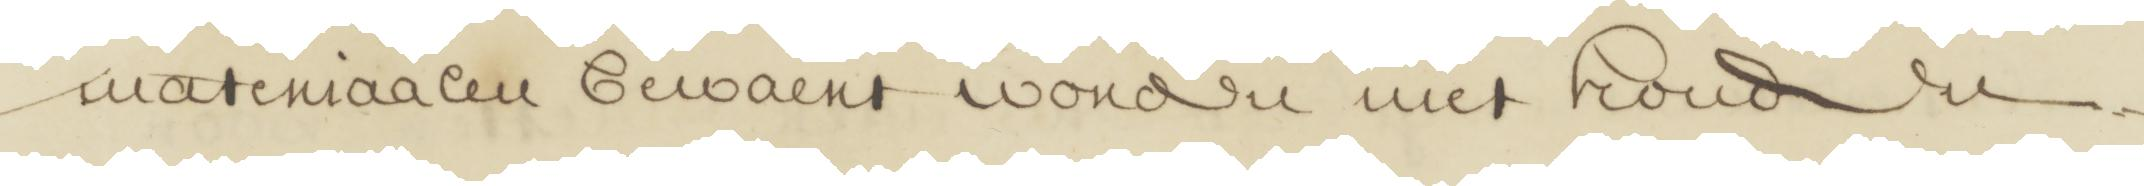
materiaalen bewaert worden niet konden„
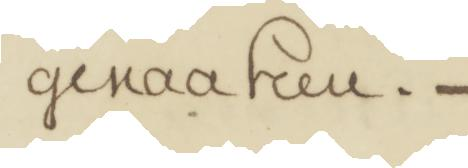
geraaken.
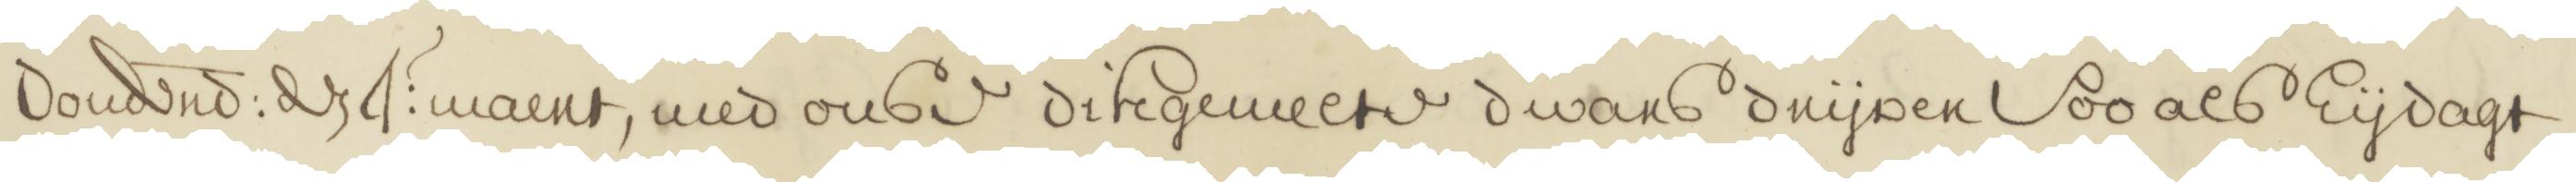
Donderd: den 4:' maert, med onse dikgemelte dwars drijver soo als hijdagt
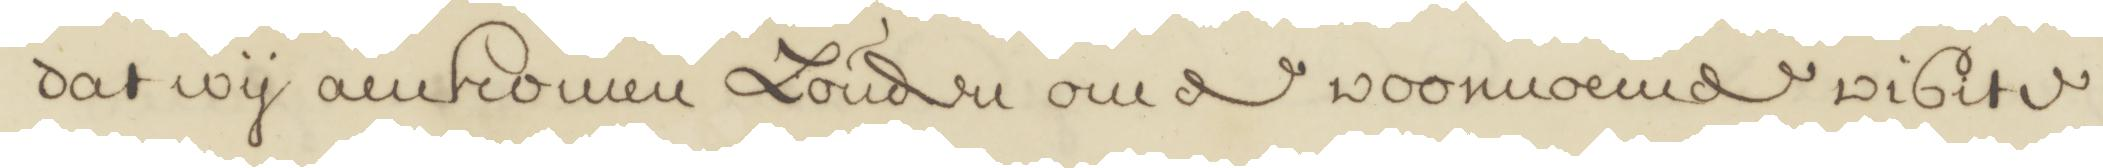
dat wij aenkomen Zouden om de voornoemde visite
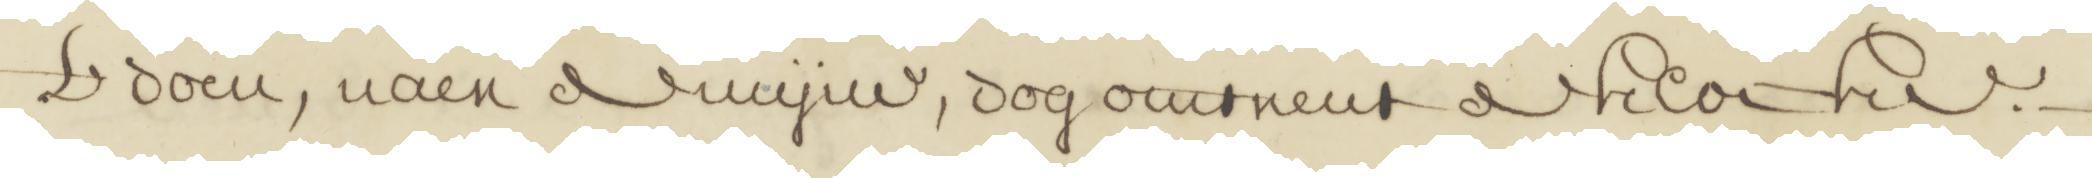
te doen, naer de mijne, dog omtrent de klocke.
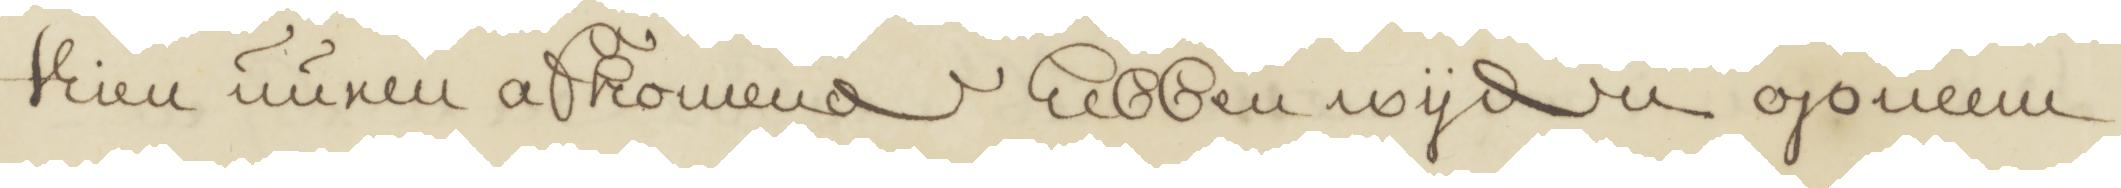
thien uuren afkomende hebben wijden opneem
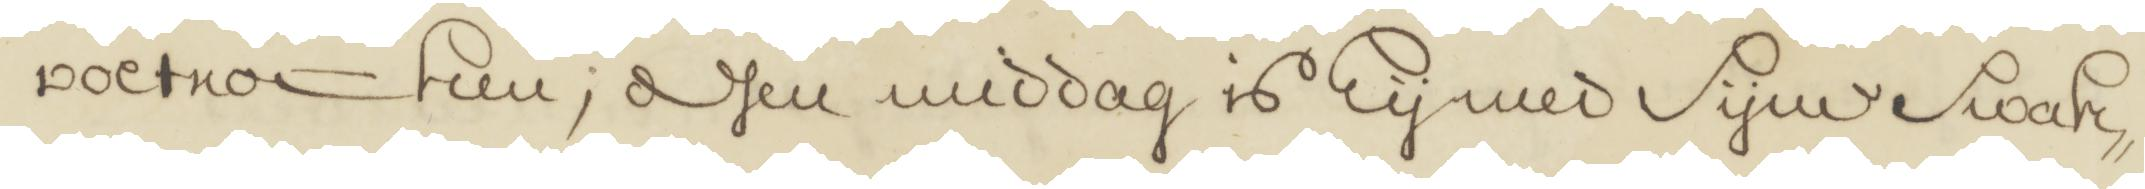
voltrocken; desen middag is hij med Sijne Swak„
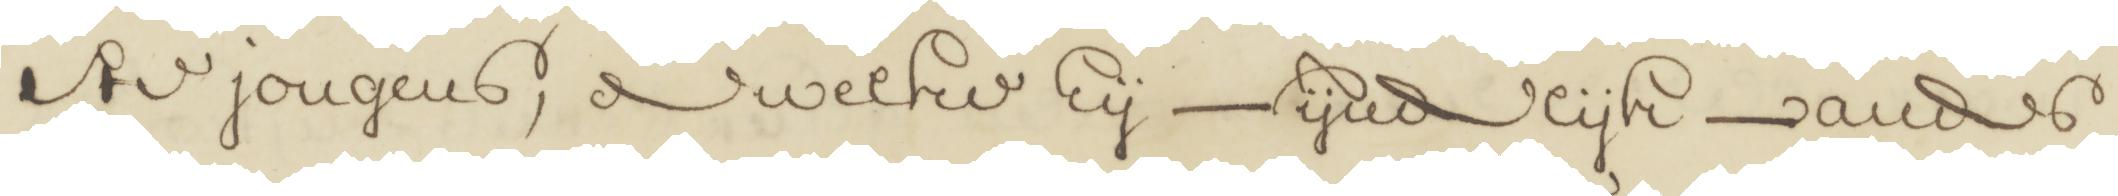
Ste jongens, dewelke hij Eijndelijk vandes
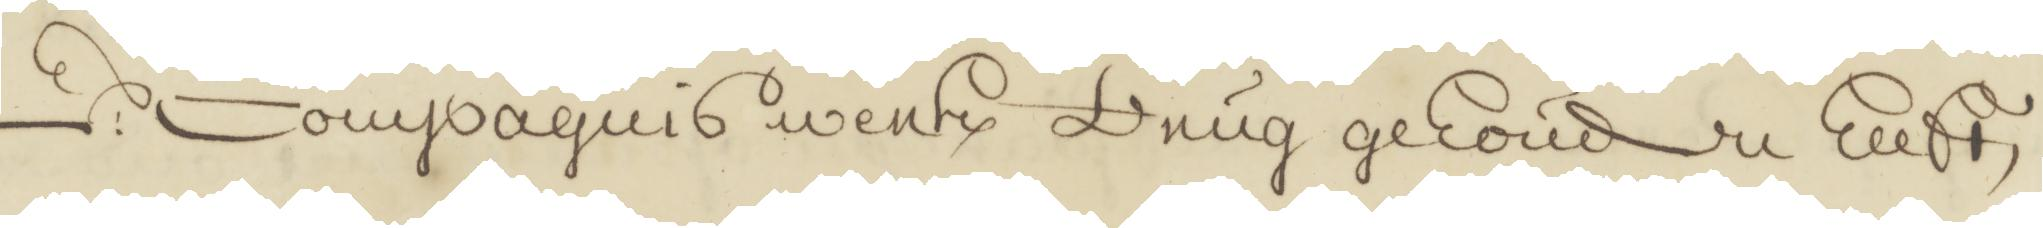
E: compagnis werk terug gehouden heeft,
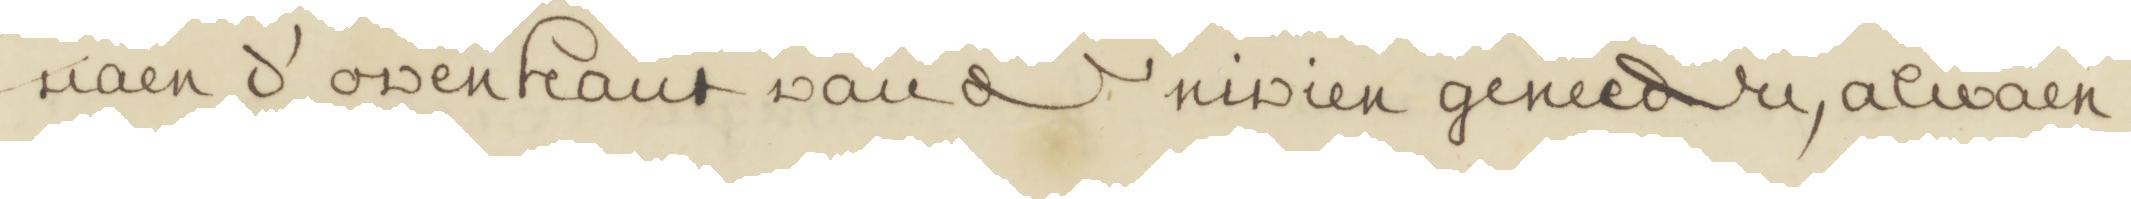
naer d’ overkant van de rivier gereeden, alwaer
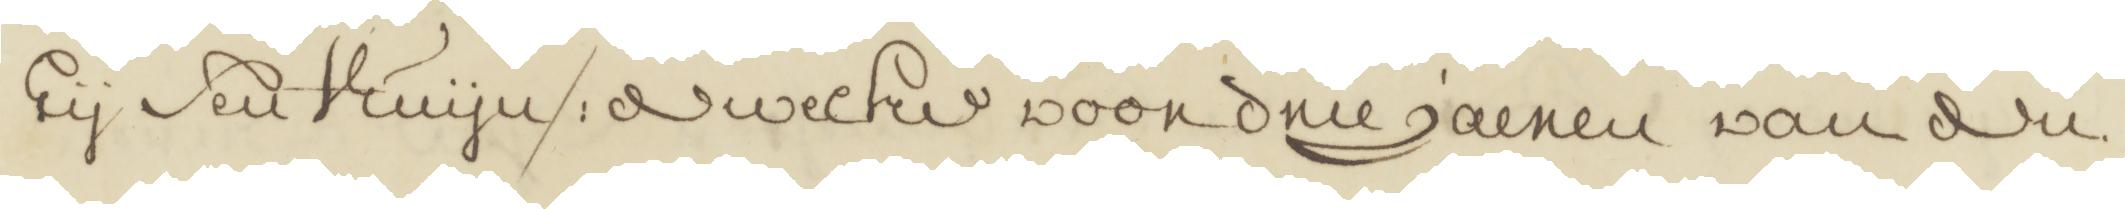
hij Een thuijn, de welke voor drie jaeren van den
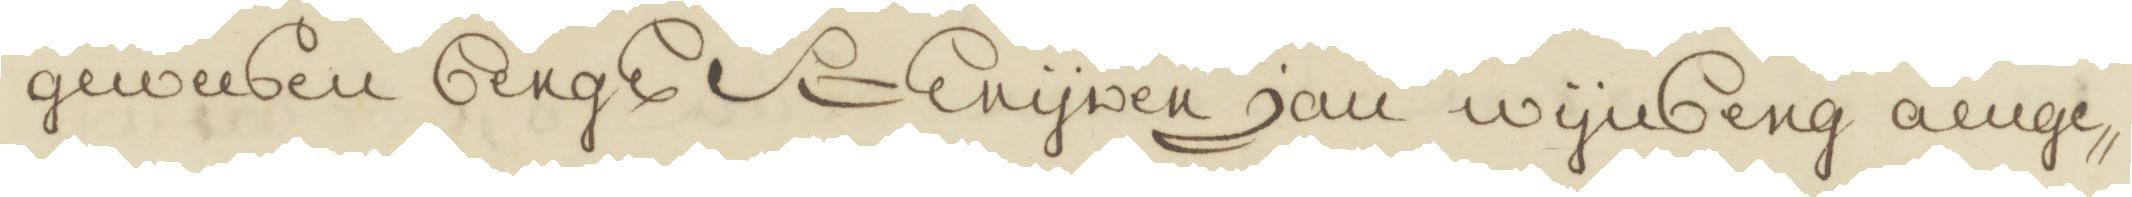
geweesen bergh Schrijver jan wijbeng aenge„
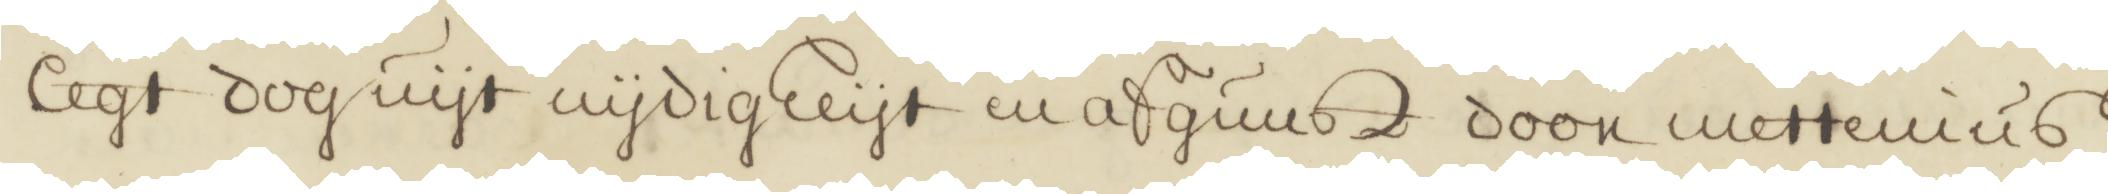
legt dog uijt nijdigheijt en afgunst door mettenius
